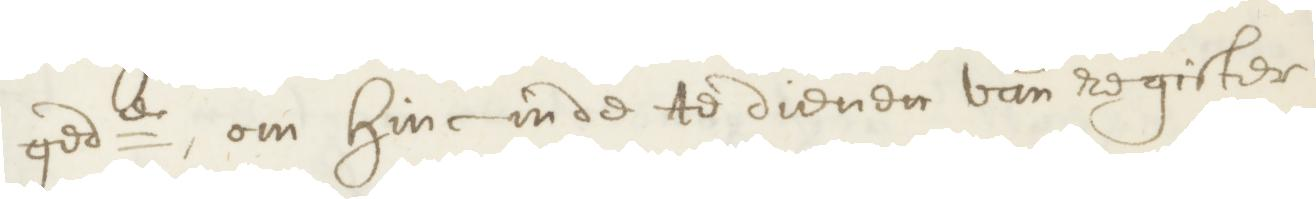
ged=e, om hinc in de te dienen van register
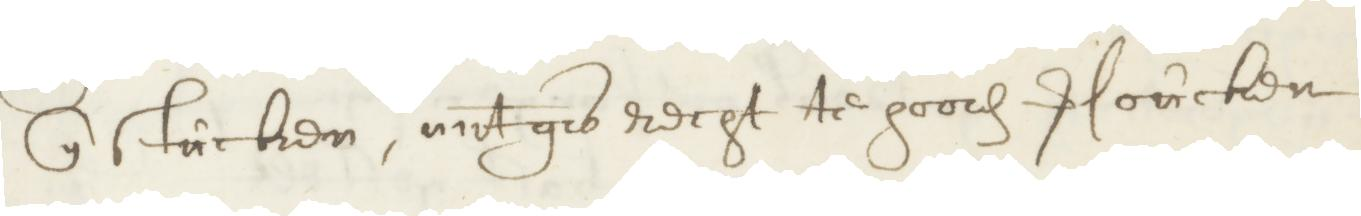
ende stucken, mitgrs recht te hooren versoucken
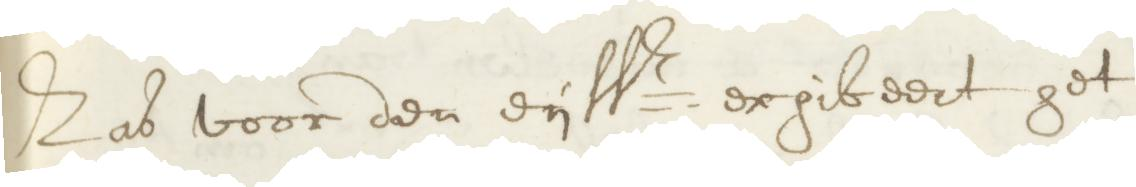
Zas voor den eijss=r exhibeert het
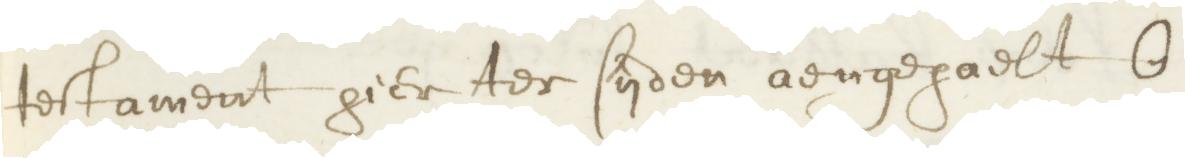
testament hier ter sijden aengepaelt ende
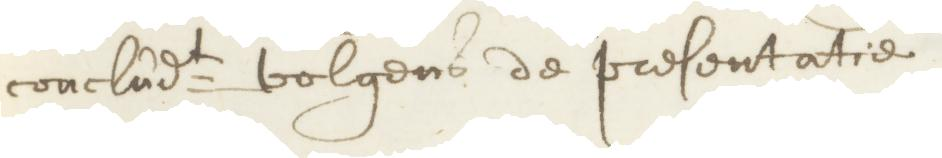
conclud=t volgens de presentatie
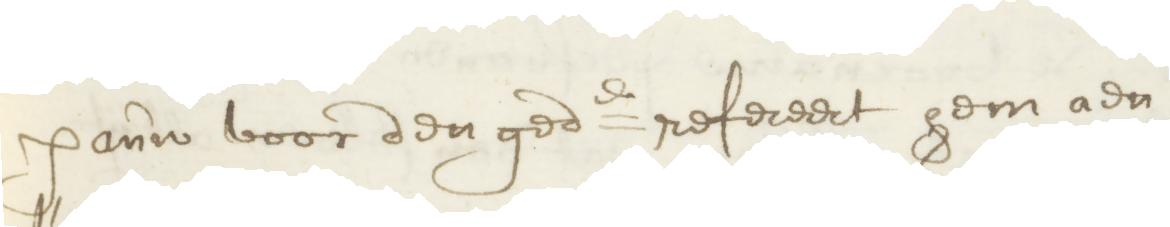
pauw voor den ged=e refereert hem aen
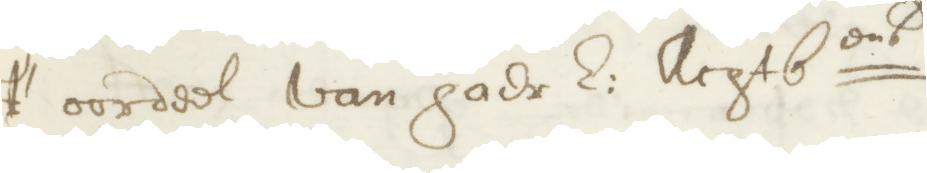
t' oordeel van haer E: Agtb=ens
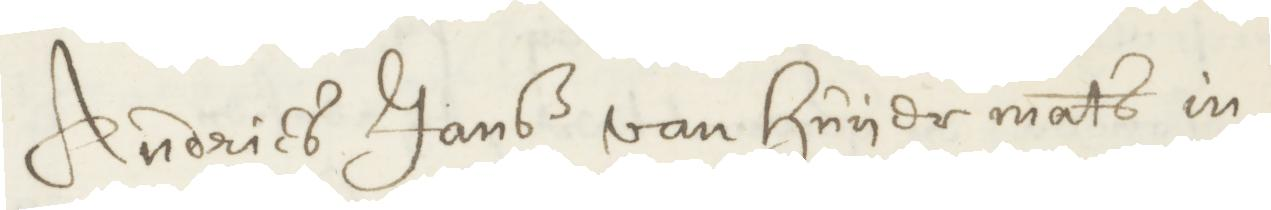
Andries Jans van huijer mats in
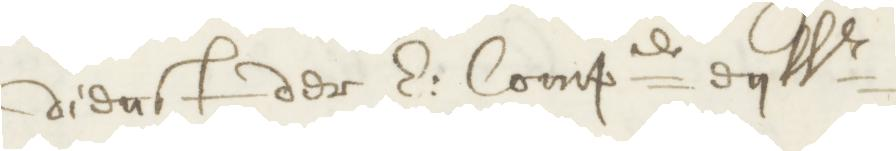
dienst der E: Comp=e eyss=r
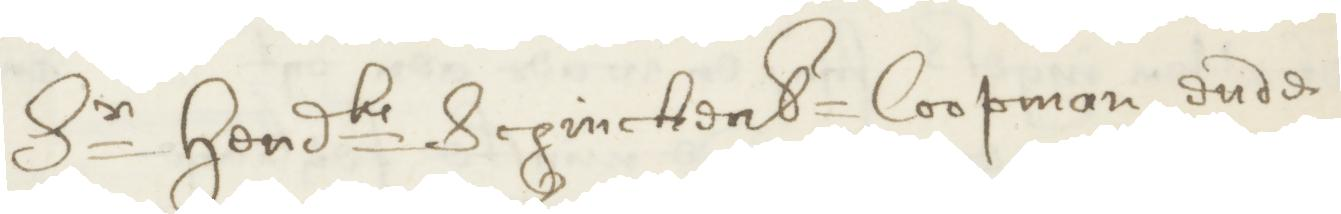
h=r hend=k Schinckenb=' Coopman ende
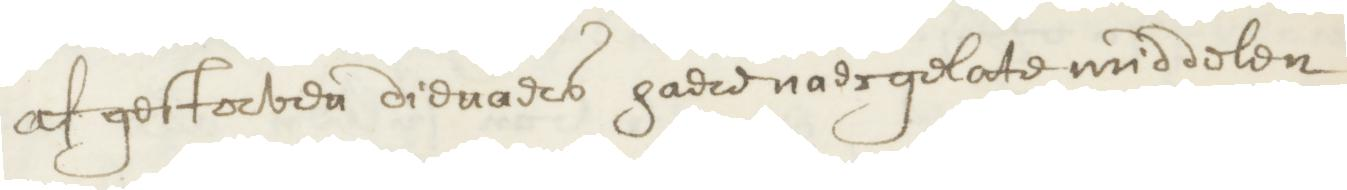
afgestoven dienaers haere naer gelate middelen
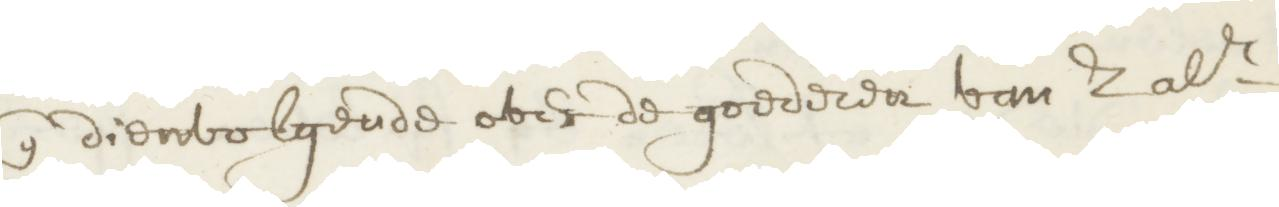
ende dienvolgende over de goederen van zal=r
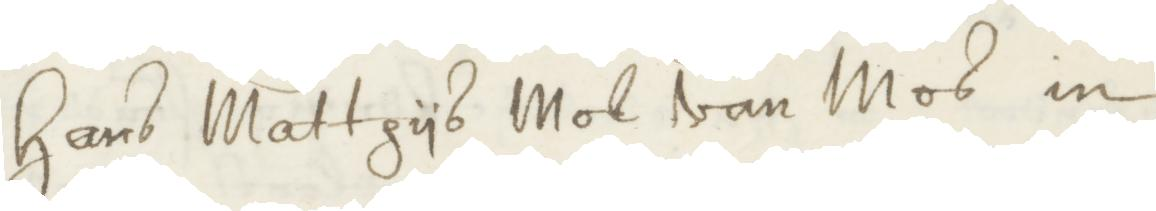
Hans Matthaijs Mol van Mos in
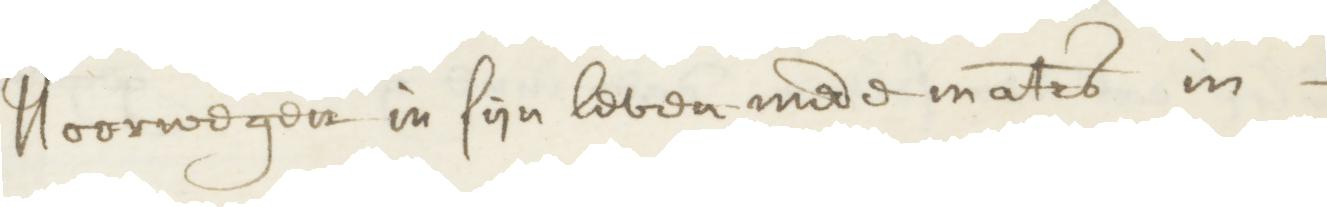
Noorwegen in sijn leven mede matrs in
